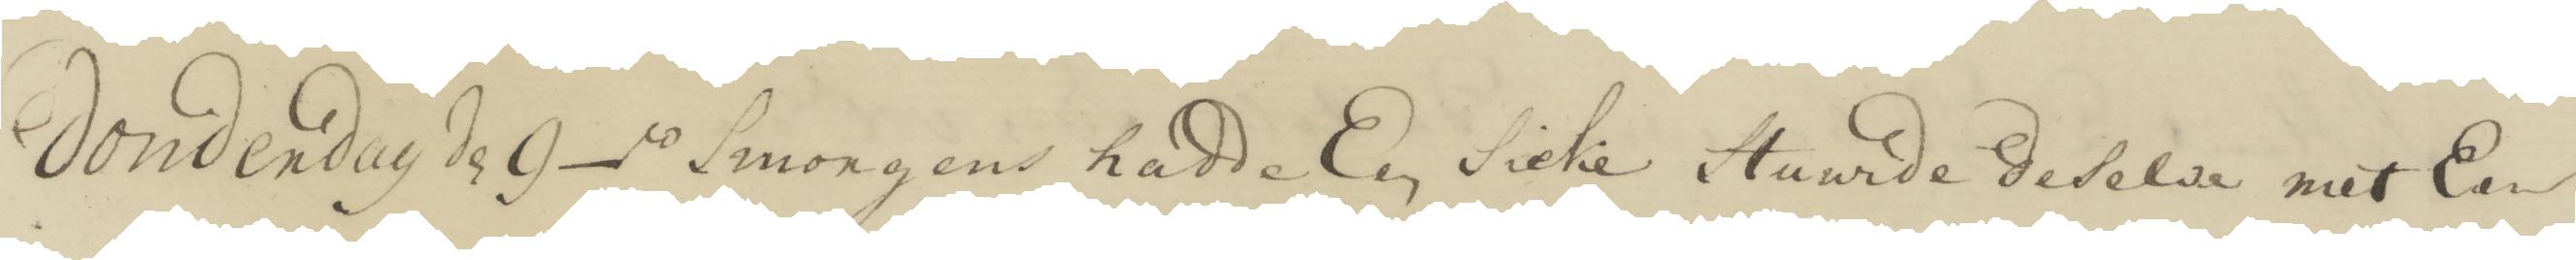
donderdag den 9 _o smorgens hadde Een sieke stuurde deselve met Een
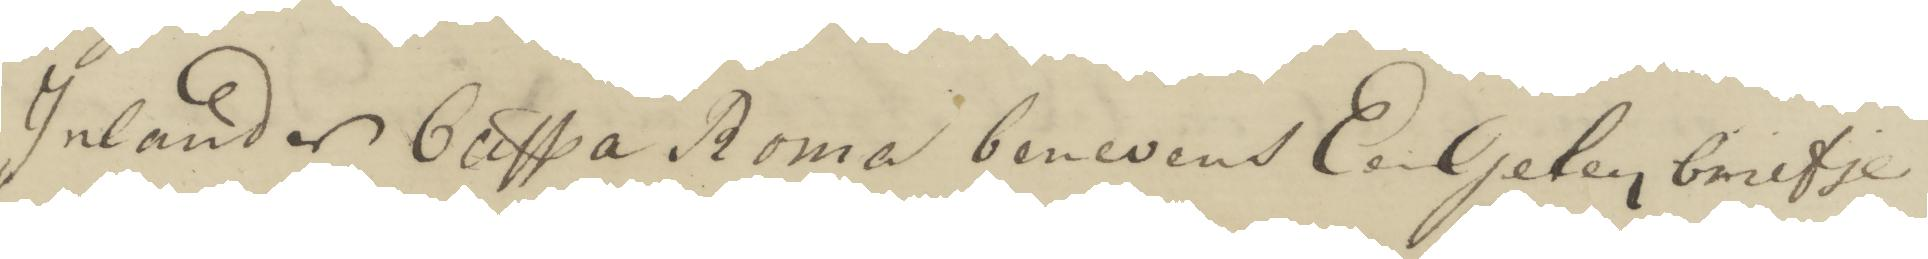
Jnlander bappa Roma benevens Een Gelen briefje
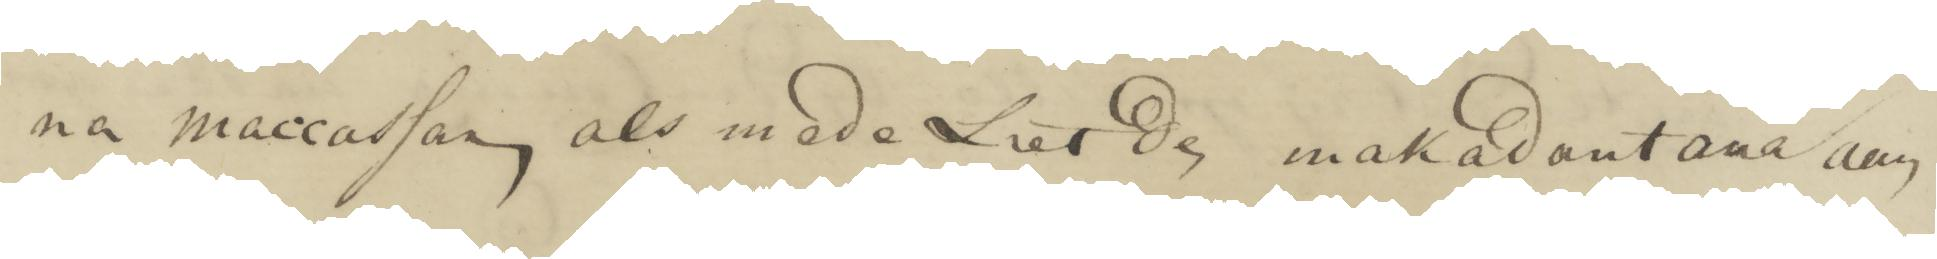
na maccassar als mede Liet den makadantana aan
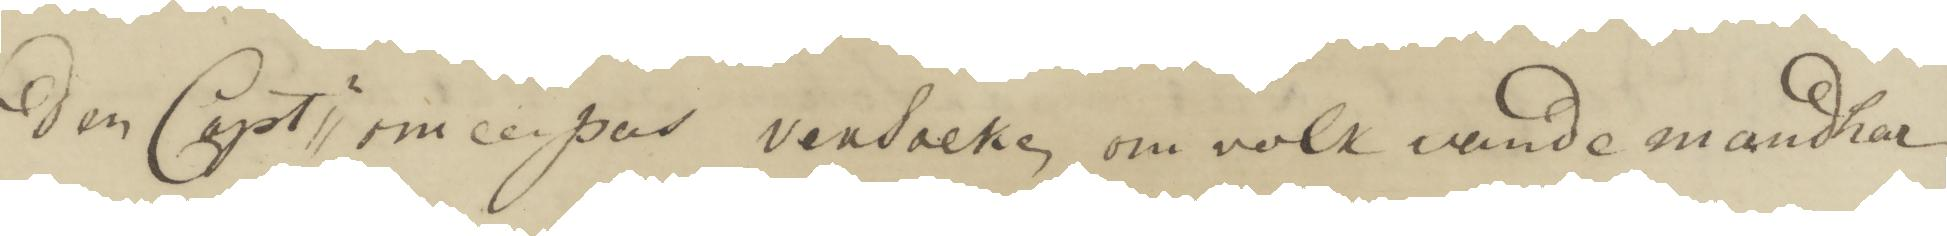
den Capt„n om een pas versoeken om volk vande mandhar
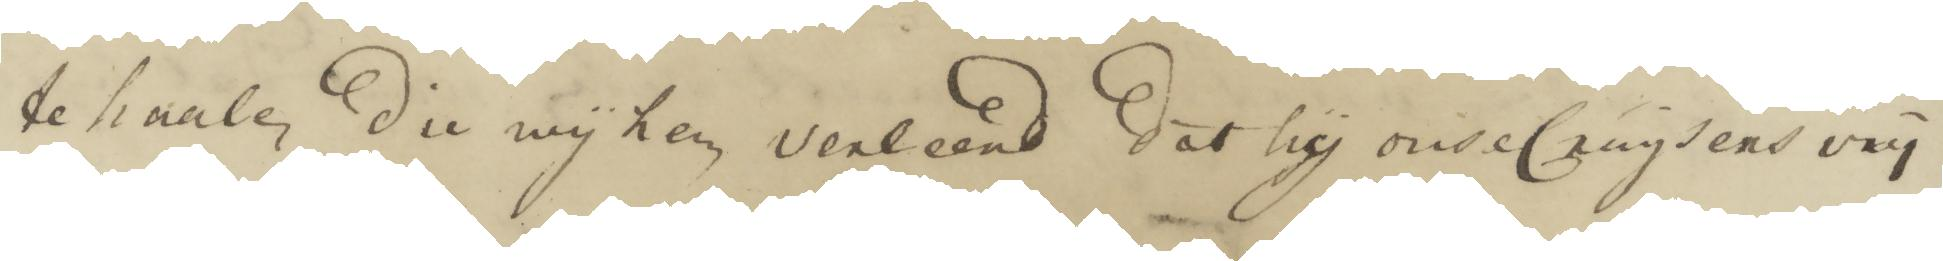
te haalen die wij hem verleend dat hij onse Cruijsers vrij
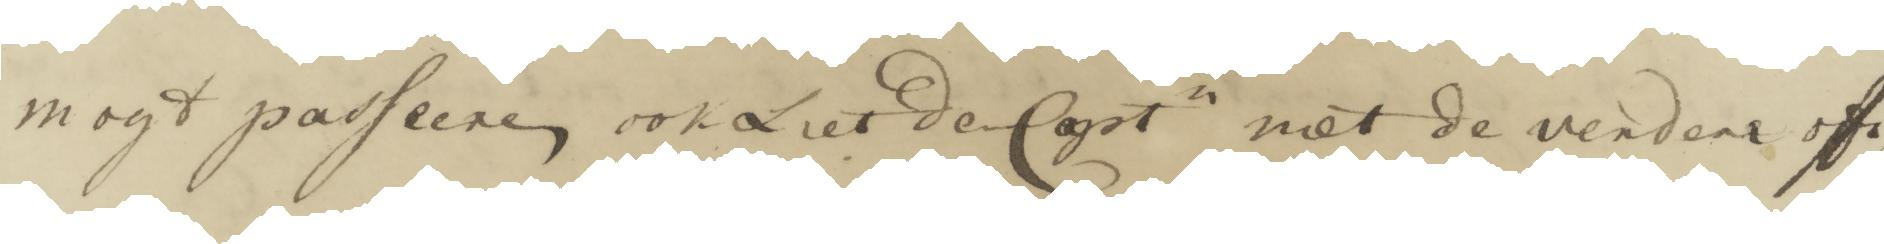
mogt passeeren ook Liet de Captn met de verdere offi
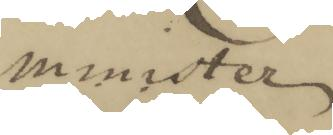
minister
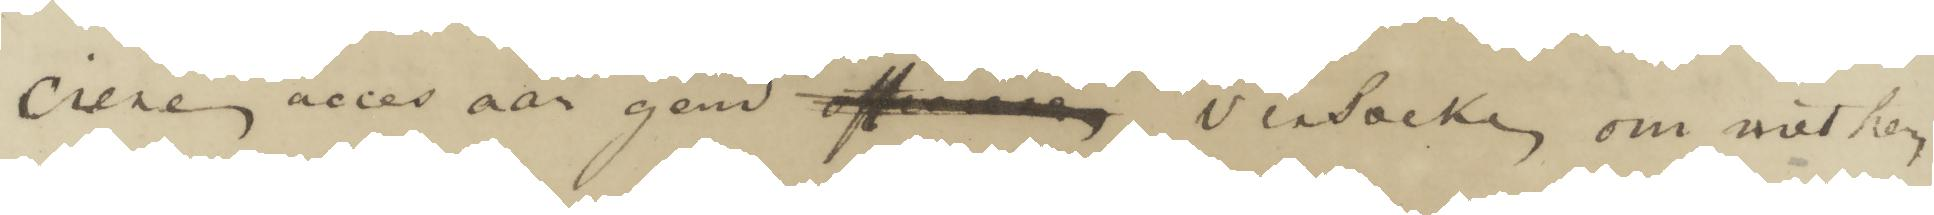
cieren acces aan gem officieren versoeken om met hem
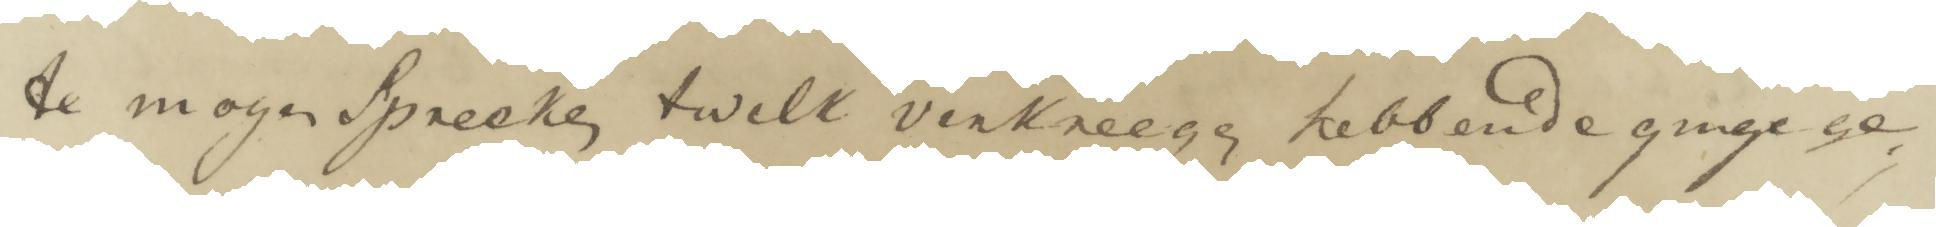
te mogen spreeken twelk verkreegen hebbende ginge ge„
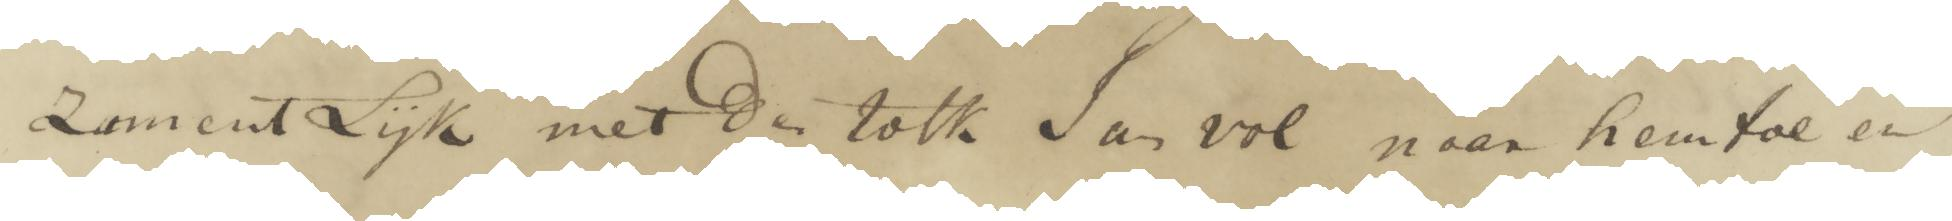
zamentlijk met den tolk Ian vol naar hem toe en
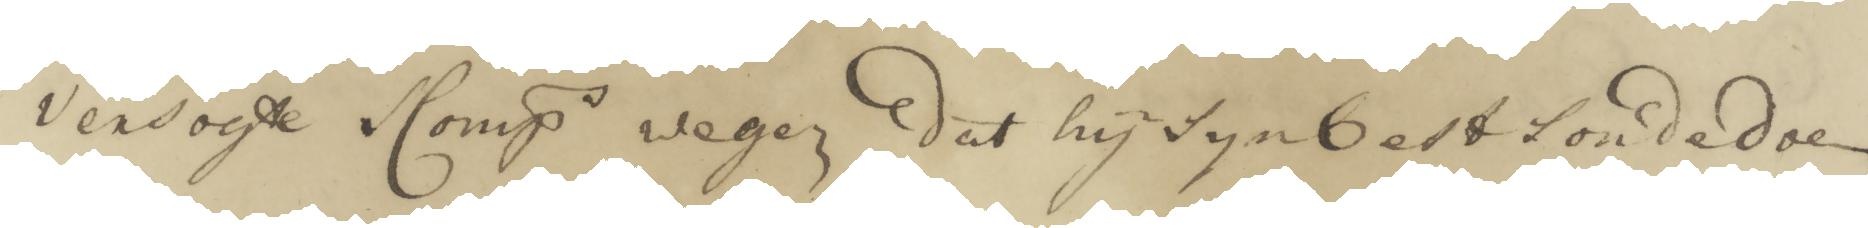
versogte sComps wegen dat hij sijn best soude doen
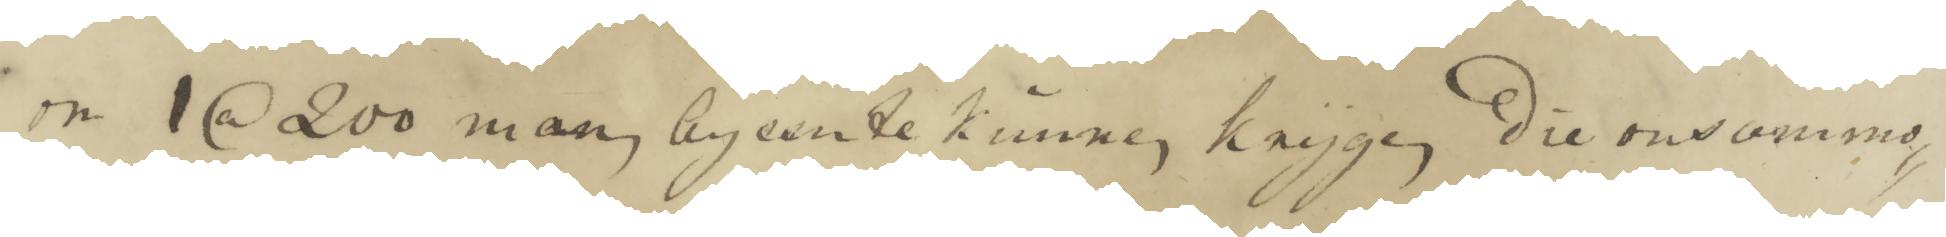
om 1 @ 200 man bij een te kunnen krijgen die ons ammo„
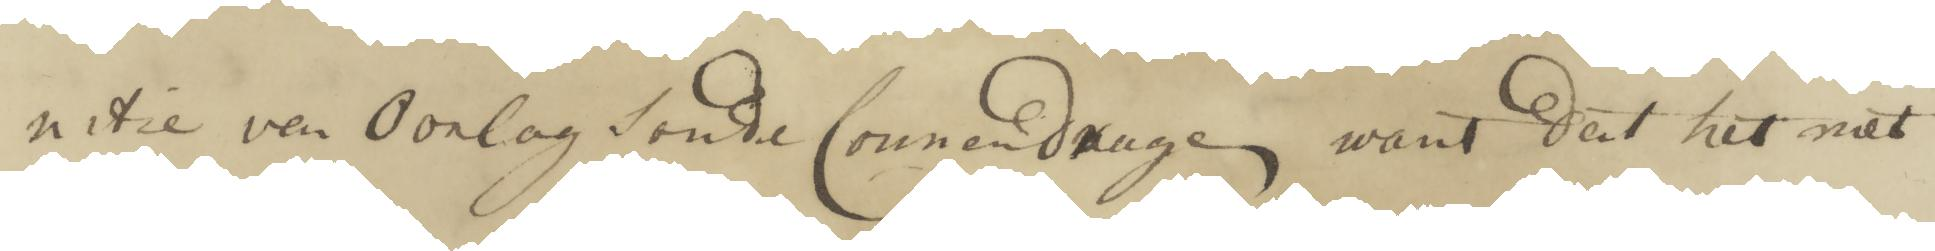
nitie van Oorlog soude Connen dragen want dat het met
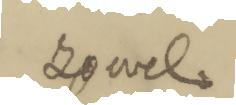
zo wel
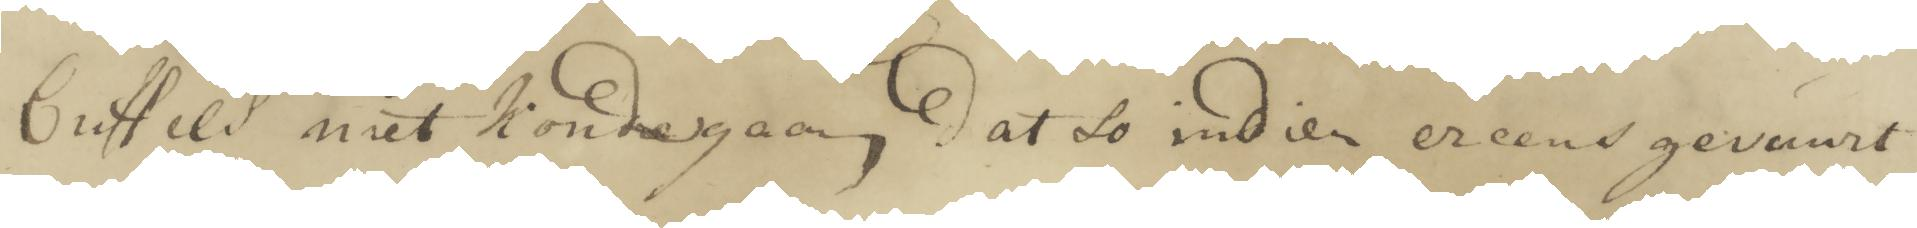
buffels niet konde gaan dat so indien er eens gevuurt
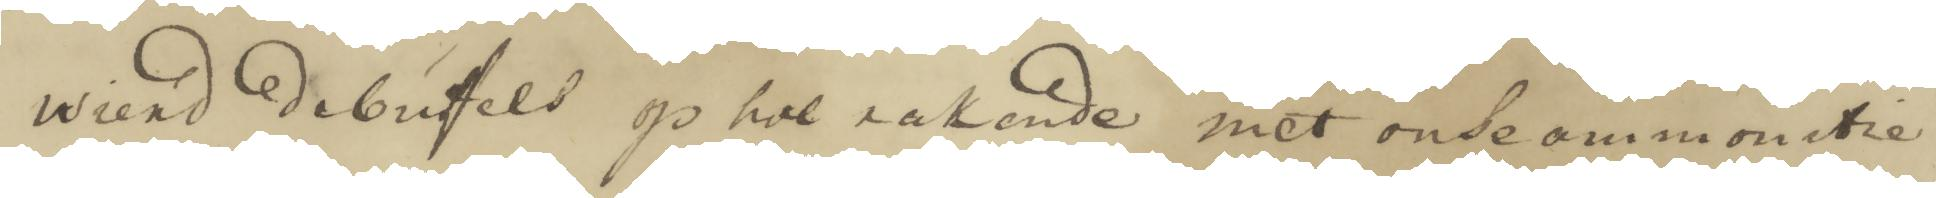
wierd de buffels op hol rakende met onse ammonitie
